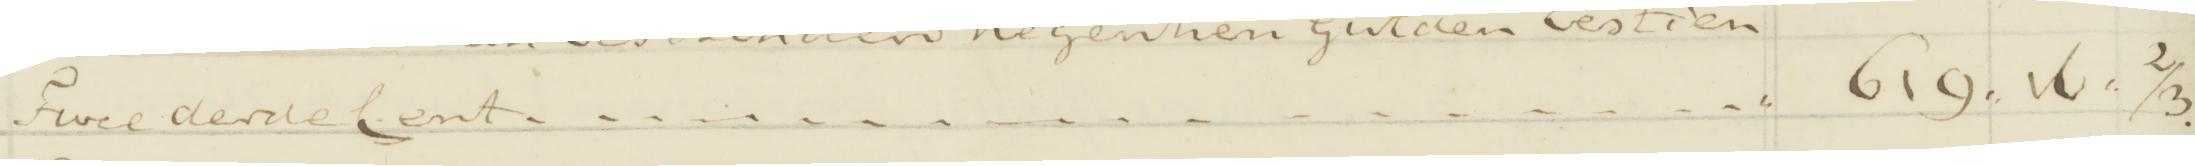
Twee derde Cent - - - - - - - - - - - - - - - - - - - „ 619„ 16„ 2/3.
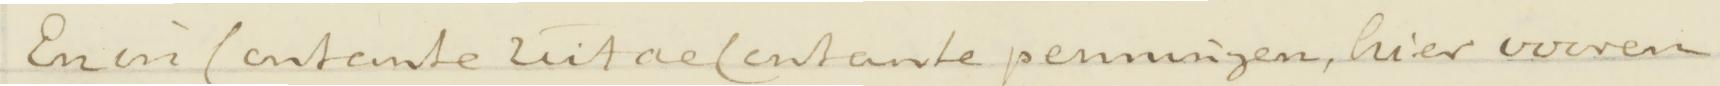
En in Contante uit de Contante penningen, hier vooren
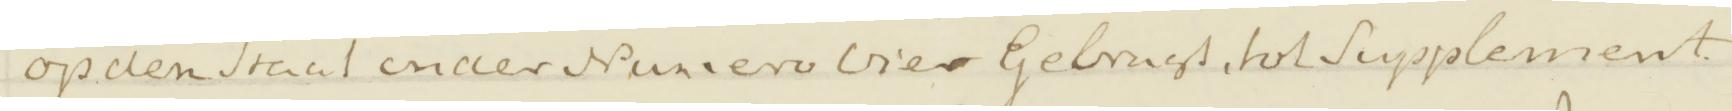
op den Staat onder Numero vier Gebragt, tot Supplement
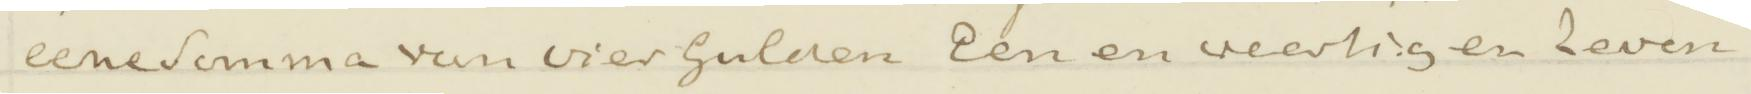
eene Somma van vier Gulden Een en veertig en zeven
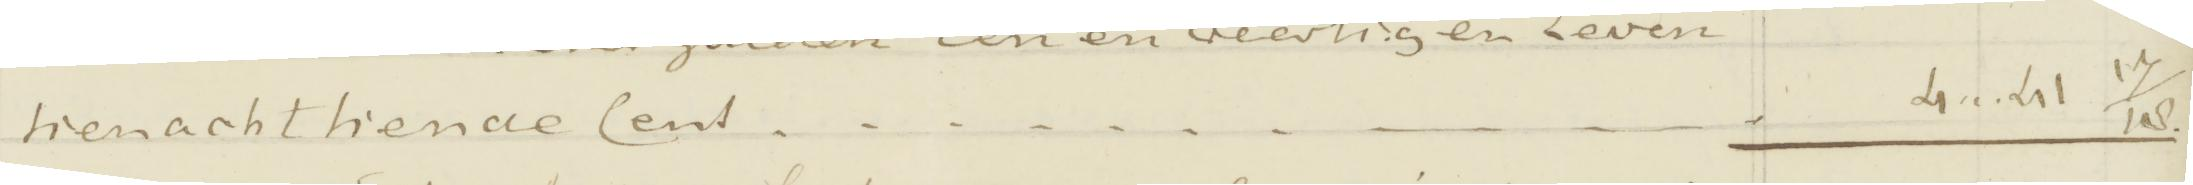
tien achttiende Cent - - - - - - - - - - - „ 4„. 41 17/18.
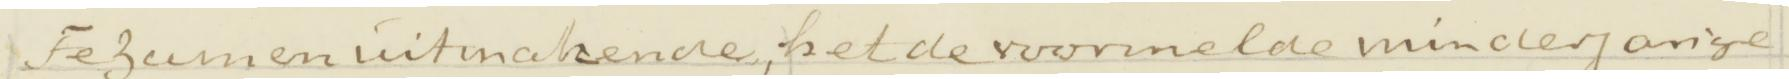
Te zamen uitmakende, het de voormelde minderjarige
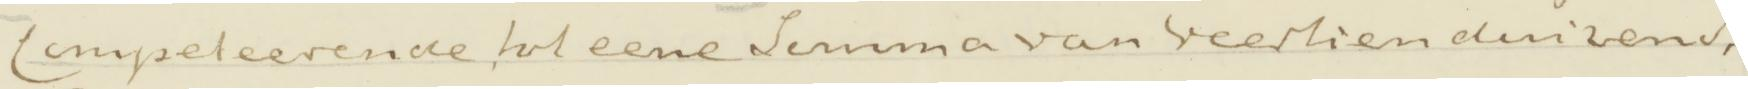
Competeerende tot eene somma van veertien duizend,
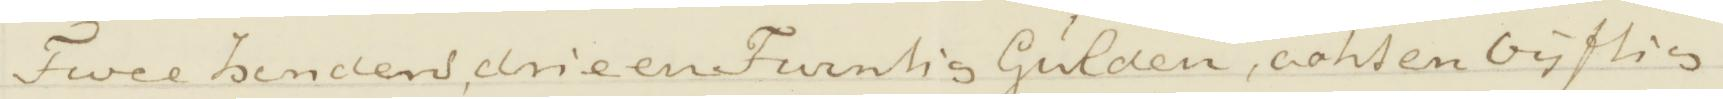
Twee honderd, drie en Twintig Gulden, acht en vijftig
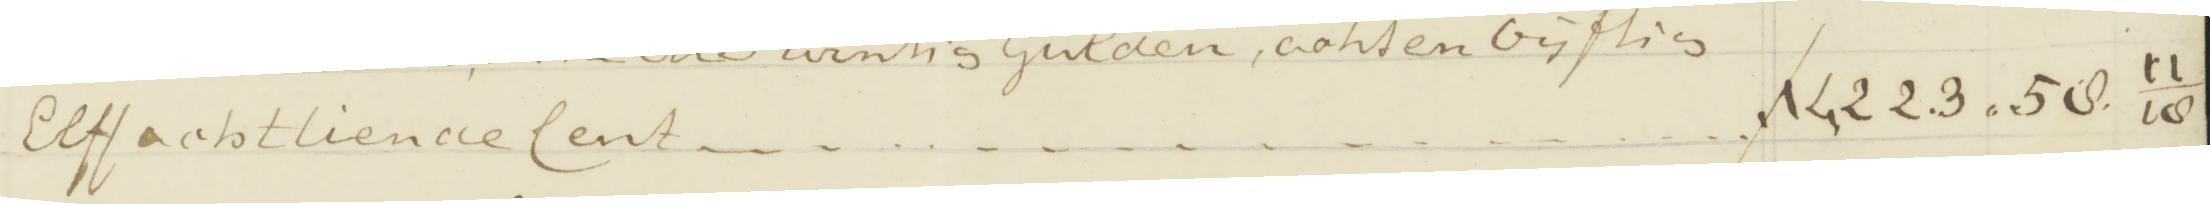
Elff achttiende Cent - - - . . - - - - - - - . . . . . . ƒ1422.3 „ 58. 11/18
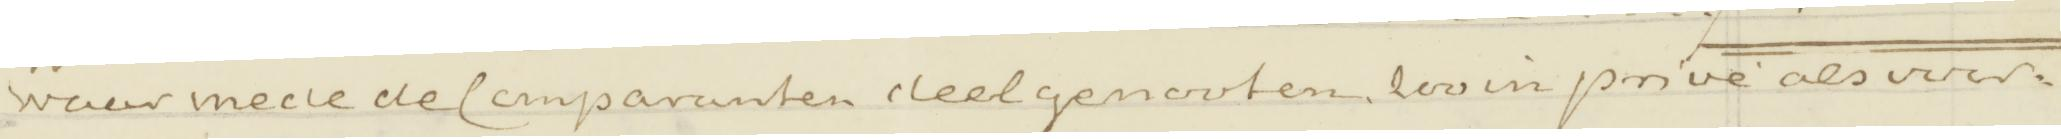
waarmede de Comparanten deel genooten, zoo in privé als voor=
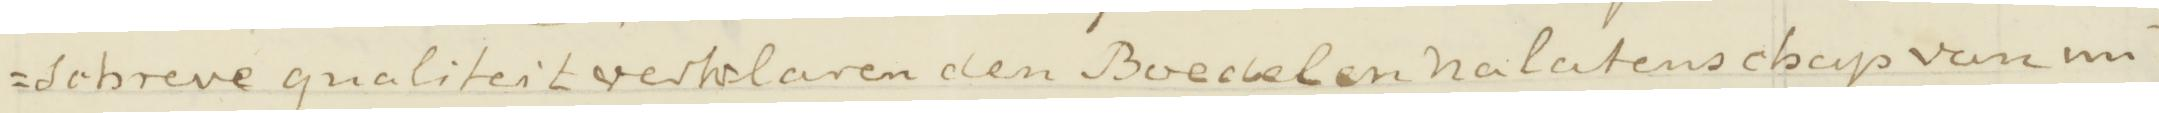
=schreve qualiteit verklaren den Boedel en nalatenschap van nu
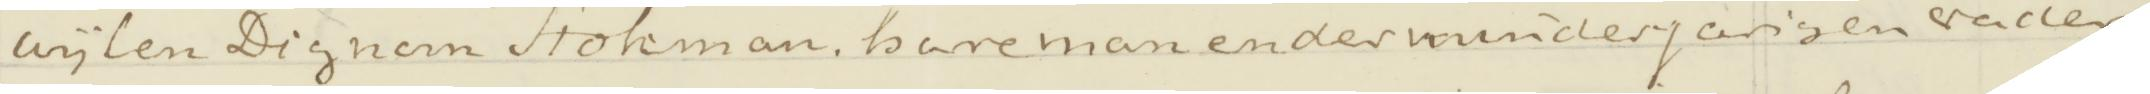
wijlen Dignom Stokman, hare man en der minderjarigen vader
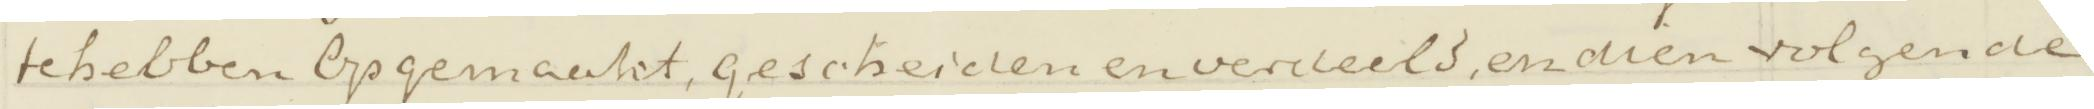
te hebben opgemaakt, gescheiden en verdeeld, en dien volgende
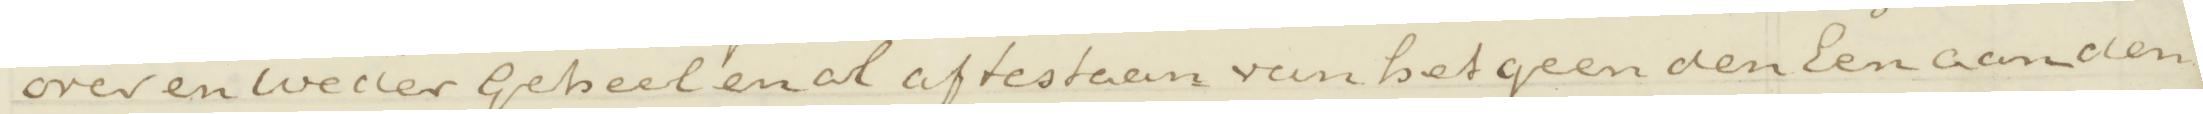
over en weder Geheel en al aftestaan van het geen den Een aan den
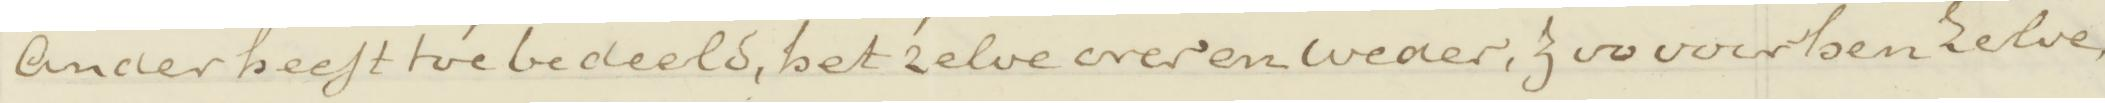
ander heeft toebedeeld, het zelve over en weder, zoo voor hen zelve
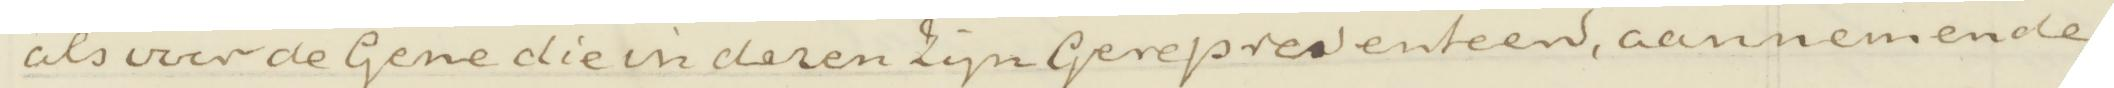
als voor de Gene die in dezen zijn Gerepresenteerd, aannemende,
